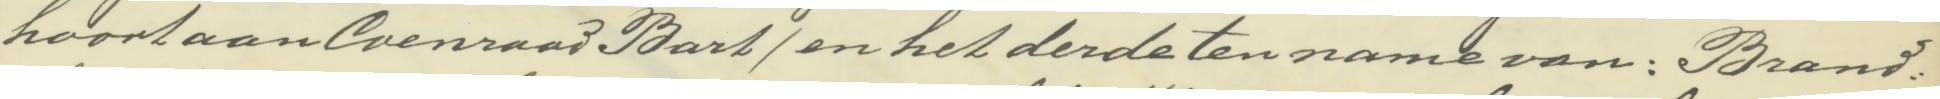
hoort aan Coenraad Bart / en het derde ten name van: Brand=
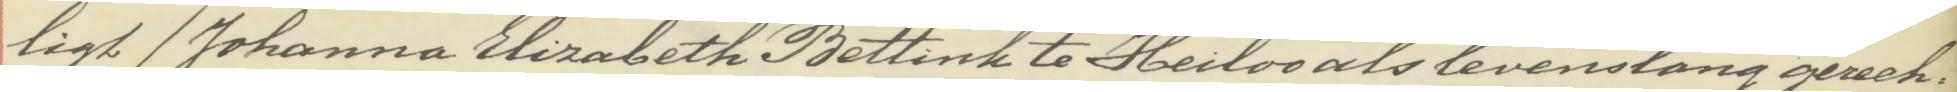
ligt / Johanna Elizabeth Bettink te Heiloo als levenslang gerech=
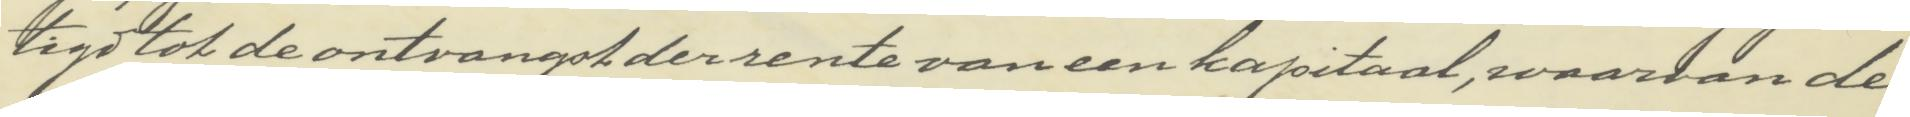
tigd tot de ontvangst der rente van een kapitaal, waarvan de
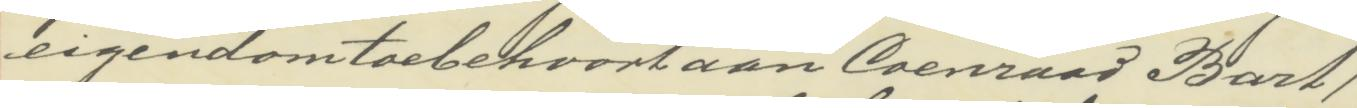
eigendom toebehoort aan Coenraad Bart/
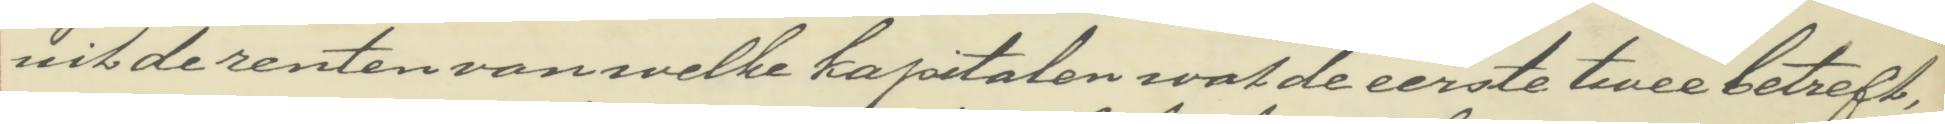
uit de renten van welke kapitalen wat de eerste twee betreft,
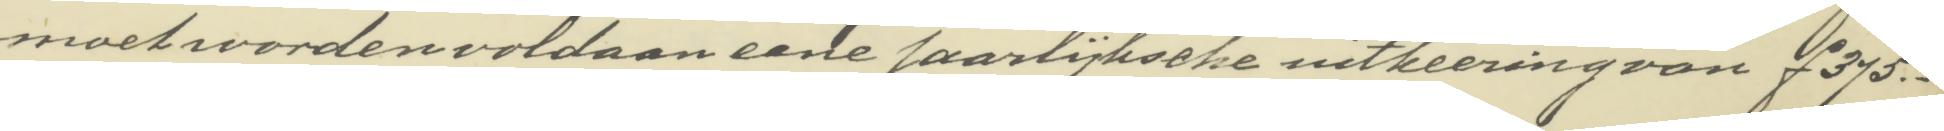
moet worden voldaan eene jaarlijksche uitkeering van ƒ 375.-
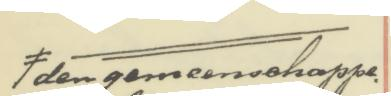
¶ den gemeenschappe.
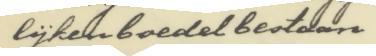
lijken boedel bestaan
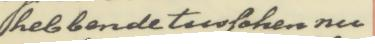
hebbende tusschen nu
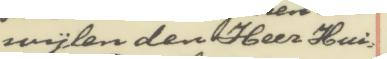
wijlen den Heer Hui=
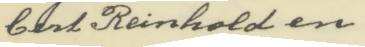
bert Reinhold en
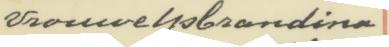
Vrouwe Ysbrandina
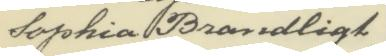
Sophia Brandligt
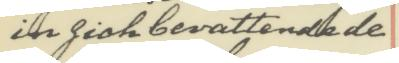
in zich bevattende de
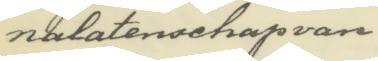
nalatenschap van
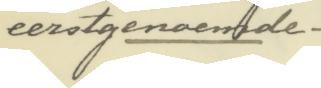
eerstgenoemde
